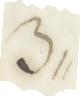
3„
